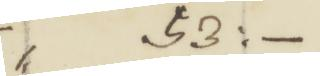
„ 53: —
